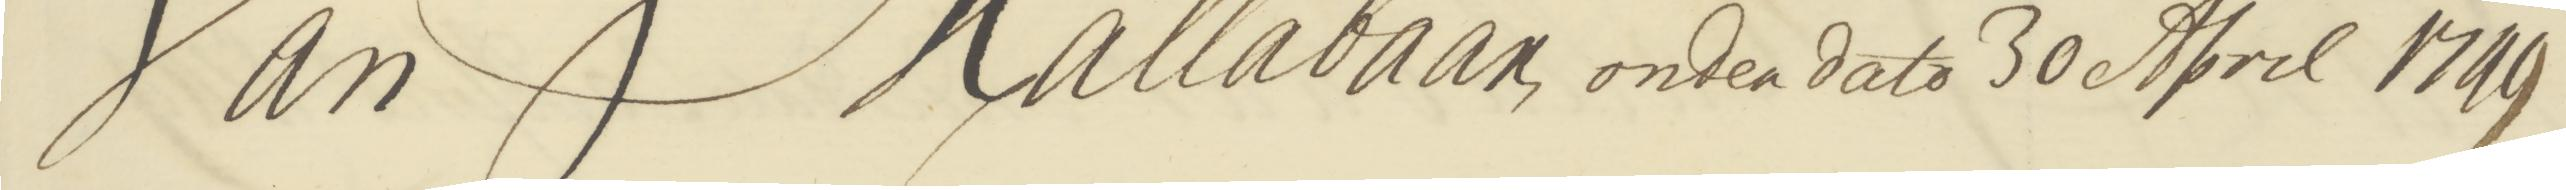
Van Mallabaar onder dato 30 April 1749
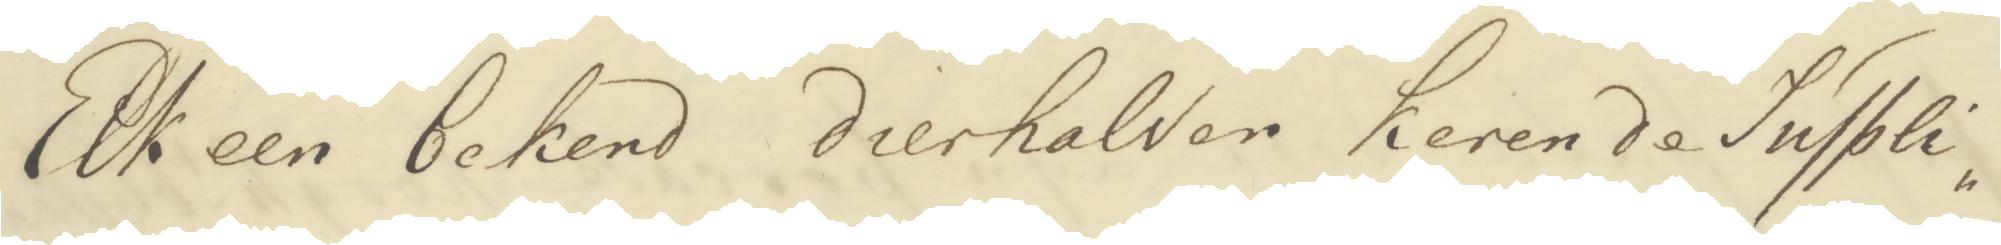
Elk een bekend dierhalven keren de suppli„
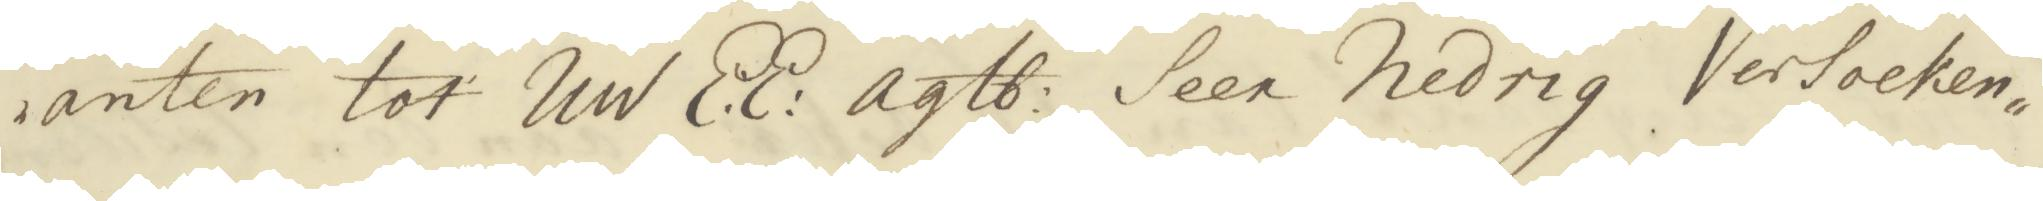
„anten tot uw E:E: agtb: seer nedrig versoeken„
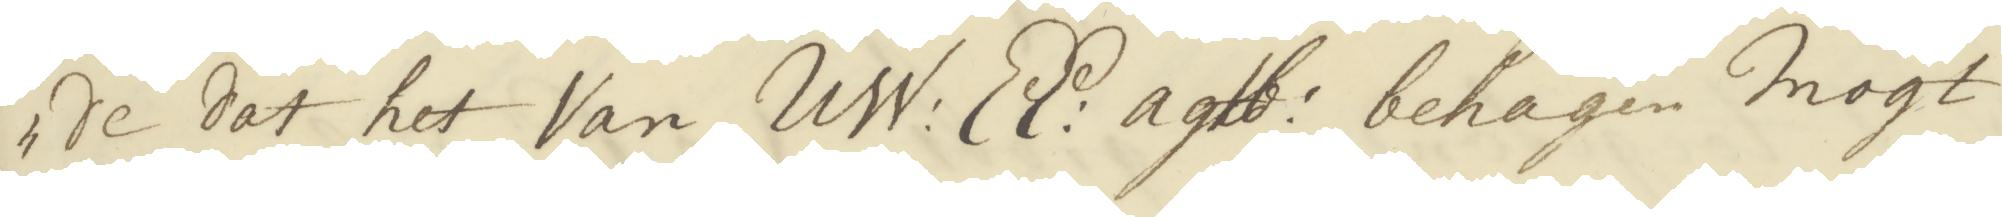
„de dat het van UW: EE: agtb: behagen mogt
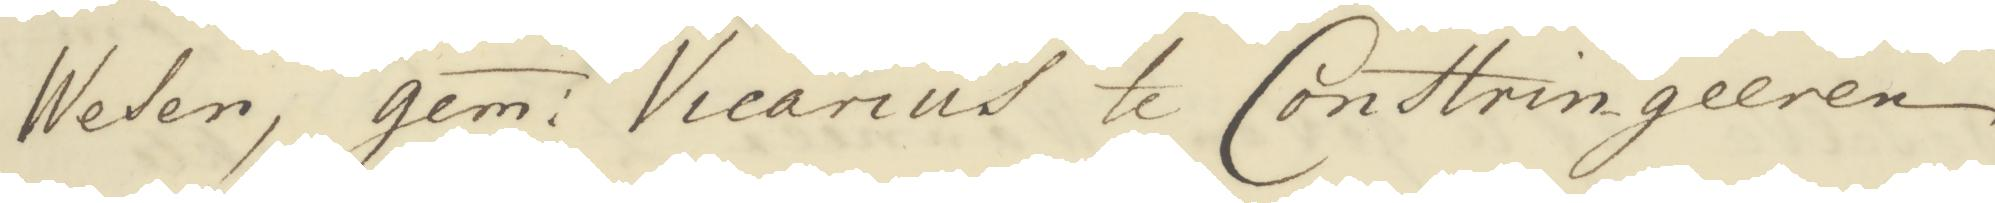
wesen, gem: vicarius te Constringeeren
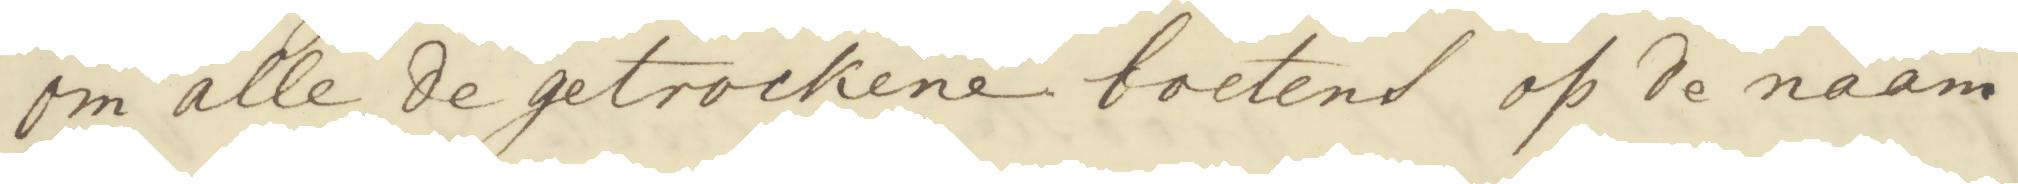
om alle de getrockene boetens op de naam
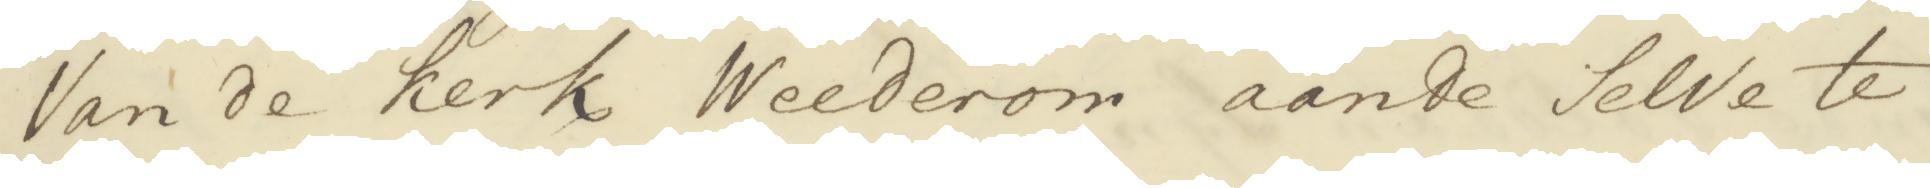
van de kerk weederom aande selve te
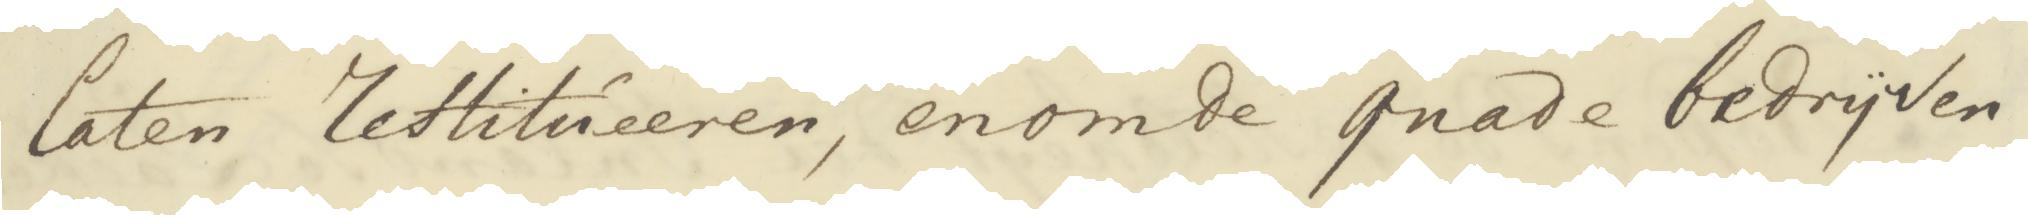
laten restitueeren, en om de quade bedrijven
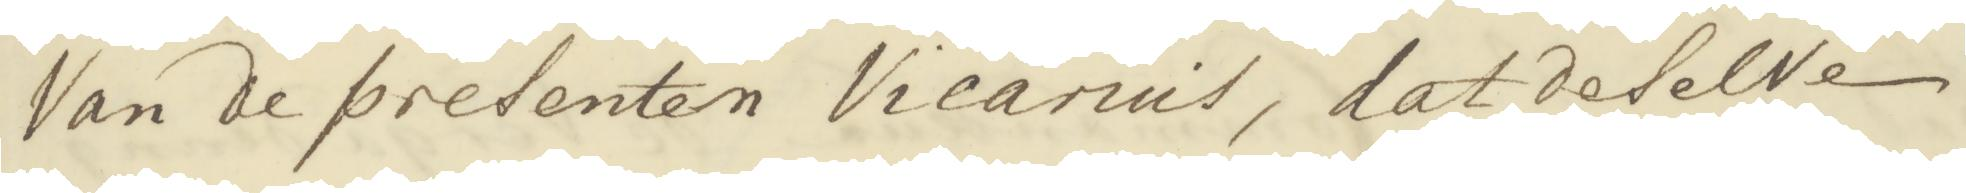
van de presenten vicarius, dat deselve
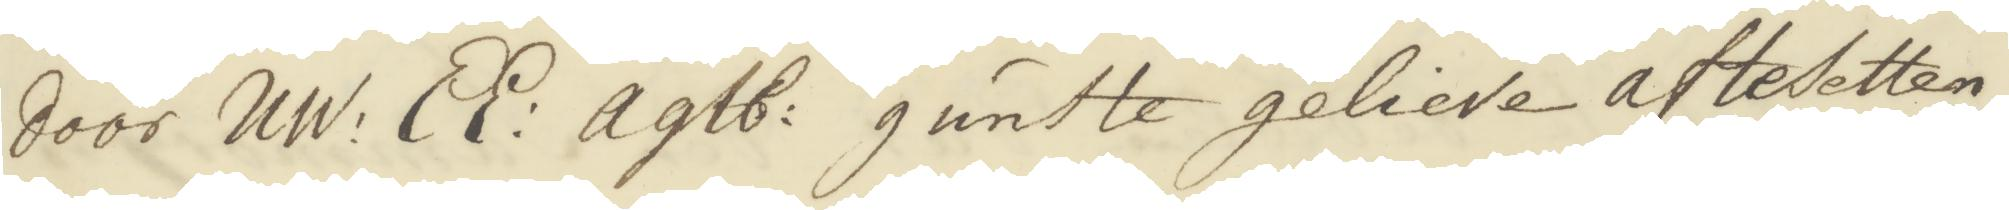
door uw: EE: agtb: gunste gelieve aftesetten
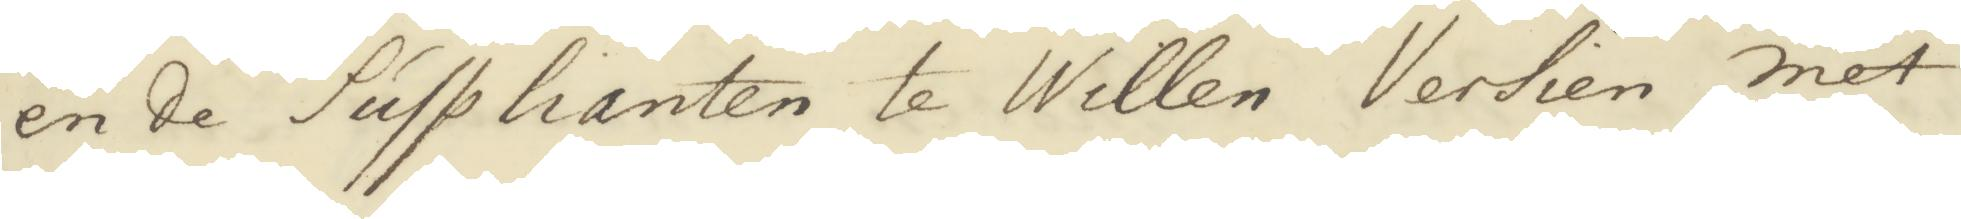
en de supplianten te willen versien met
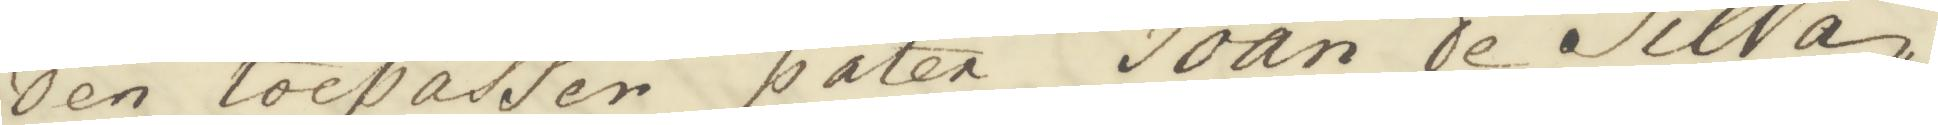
den toepasser pater Ioan de Silva,
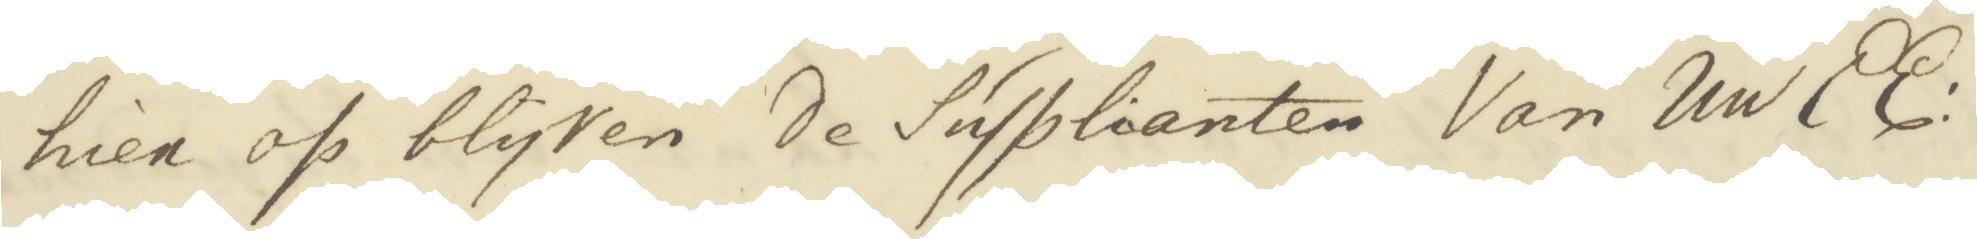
hier op blijven de supplianten van uw EE:
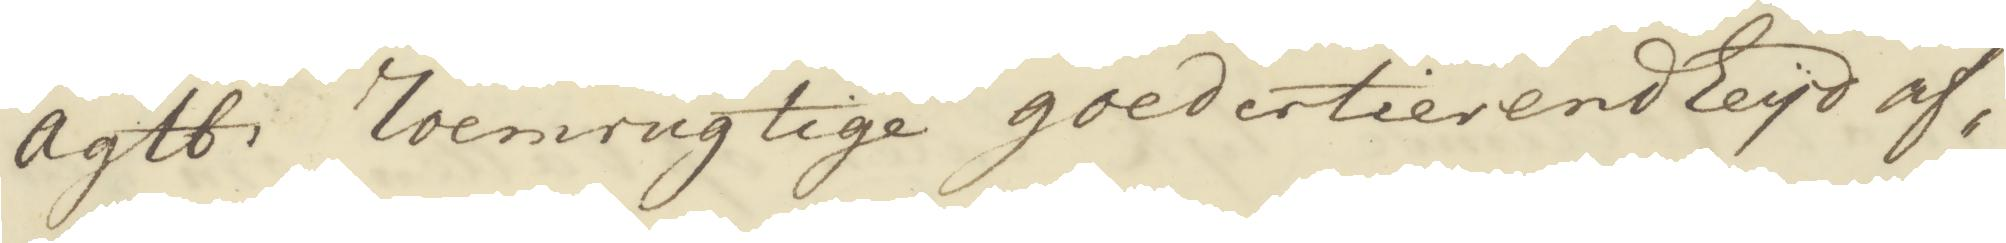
agtb: roemrugtige goedertierendheijd af„
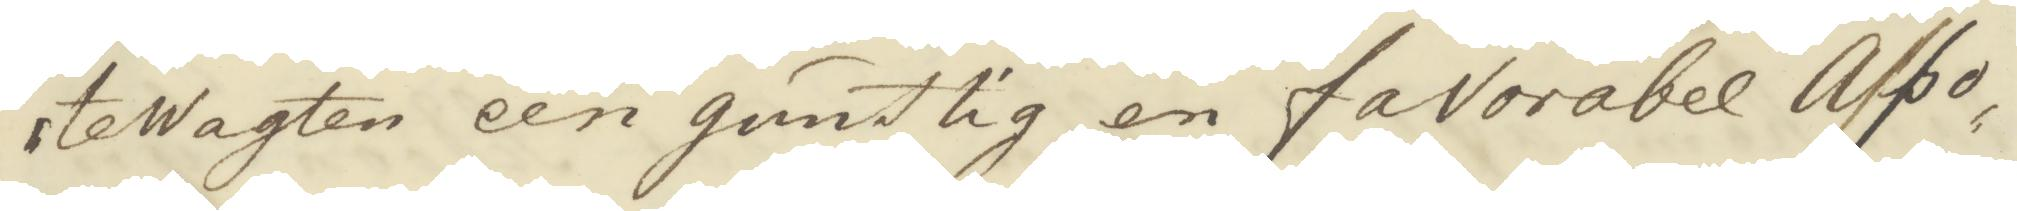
„tewagten een gunstig en favorabel Appo„
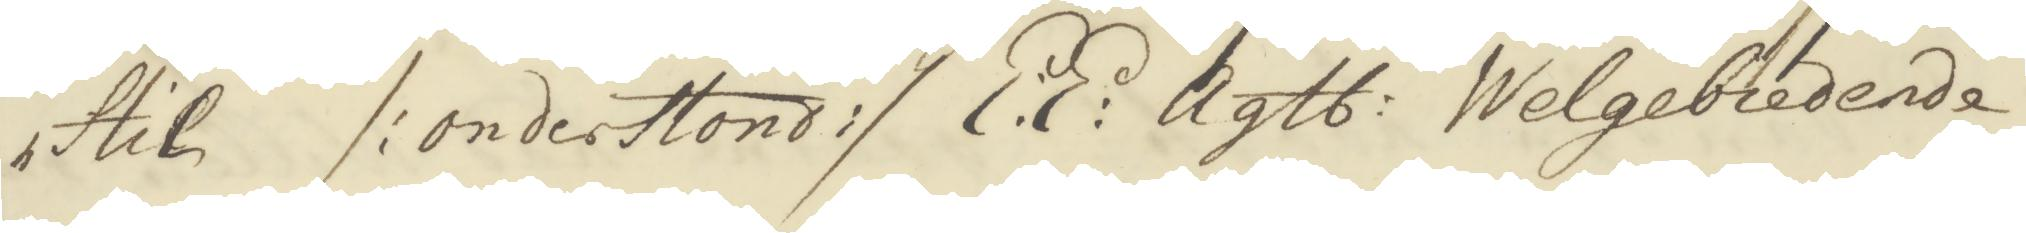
„stil /:onderstond:/ E:E: agtb: welgebiedende
